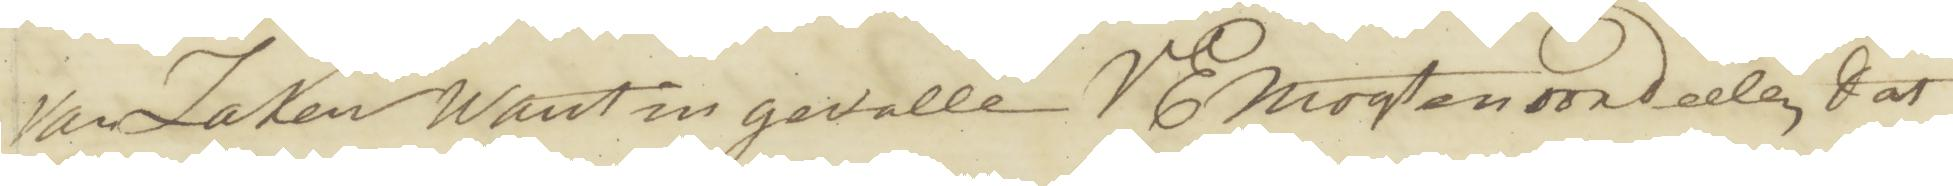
van Zaken want in gevalle VE mogten oordeelen dat
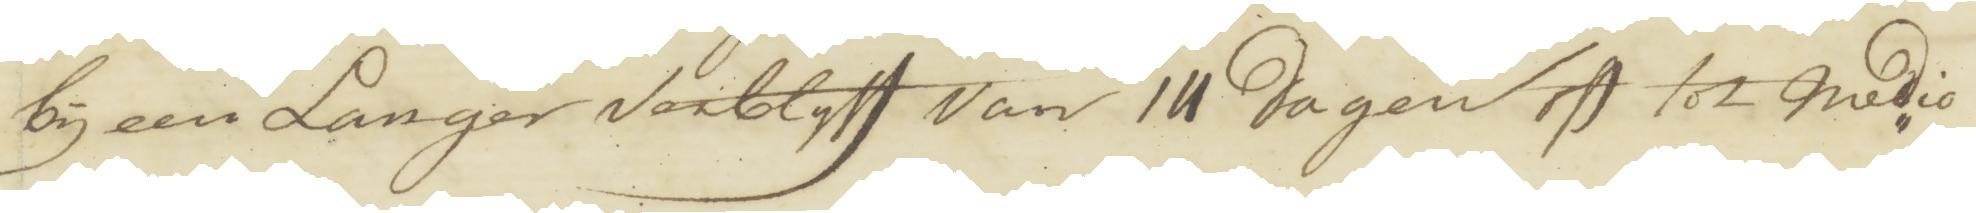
bij een Langer verblyff van 14 dagen off tot medio
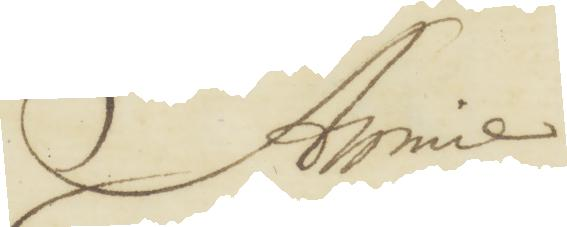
April
